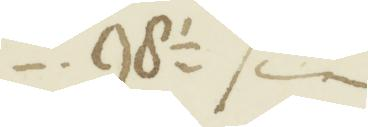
–. 98½
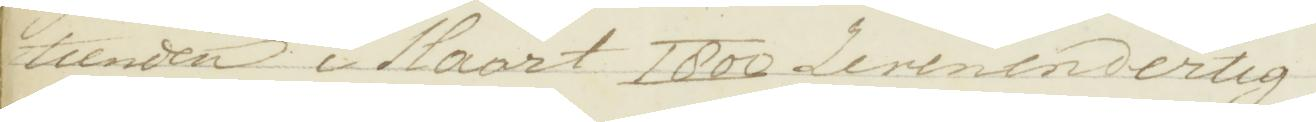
tienden Maart 1800 Zevenendertig
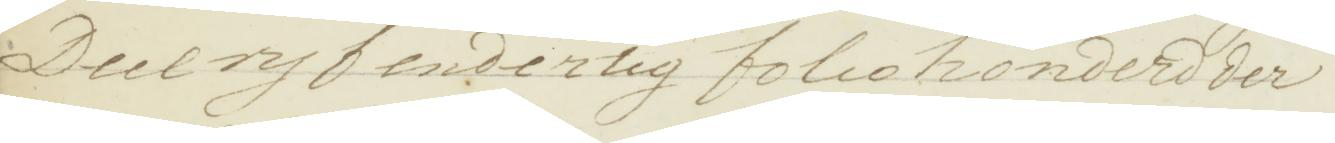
Deel vyf endertig folio honderd der
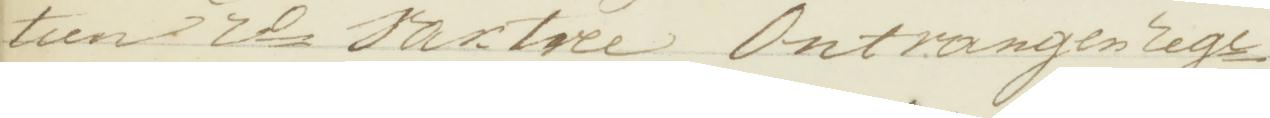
tien r=o Vak twee Ontvangen reg=e
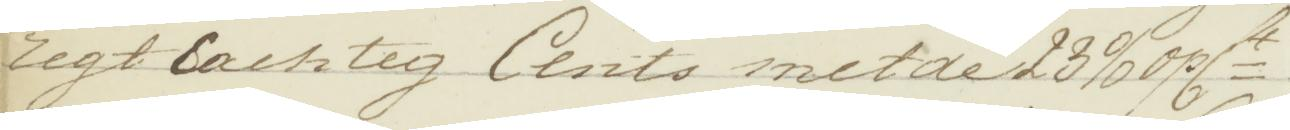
regt tachtig Cents met de 23% opC=t
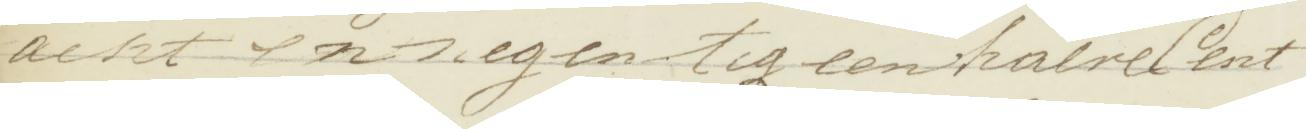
acht en negentig een halve Cent
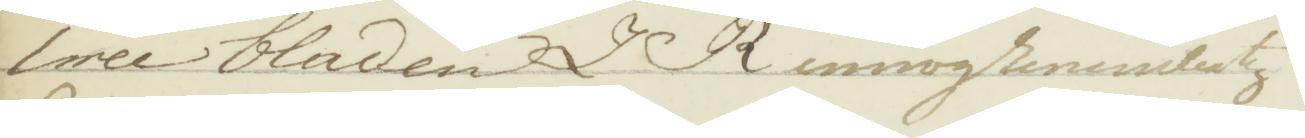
twee bladen Z R ennog Eenendertig
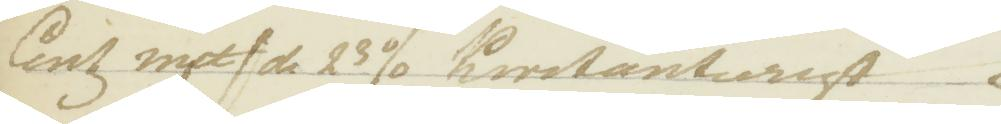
Cent met de 23% Kwitantieregt
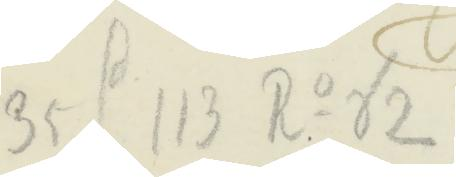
35 ƒ 113 R-o V2
